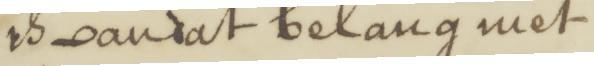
is van dat belang niet
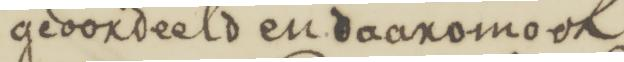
geoordeeld en daarom ook
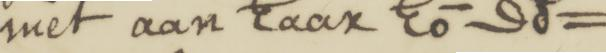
niet aan haar ho Ed=s
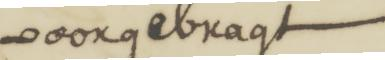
voorgebragt
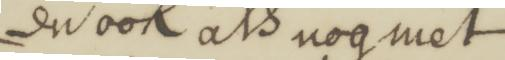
en ook als nog niet
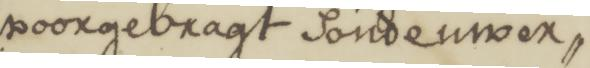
voorgebragt souden wer„
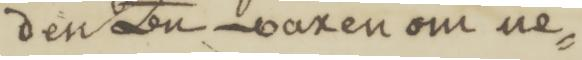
den ten waren om ne„
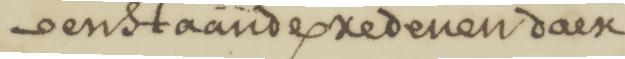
venstaande redenen daer
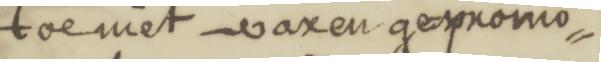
toe niet waren gepromo„
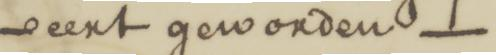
veert geworden —
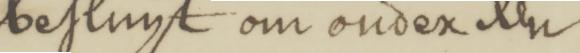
besluijt om onder den
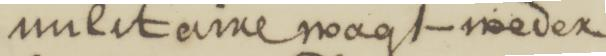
militaire wagt weder
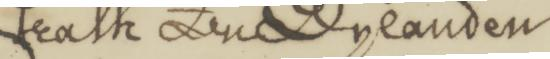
kalk ten Eylanden
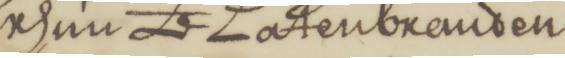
rhun te latenbranden
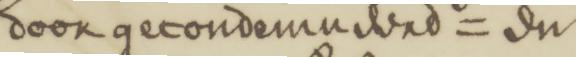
door gecondemneerd=s en
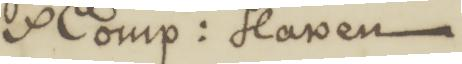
sComp:s slaven
